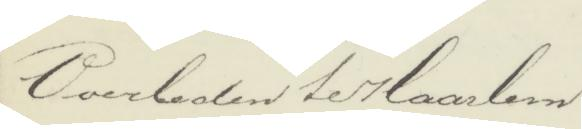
Overleden te Haarlem
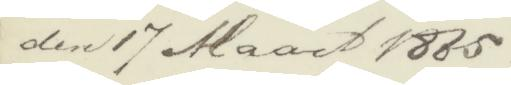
den 17 Maart 1885
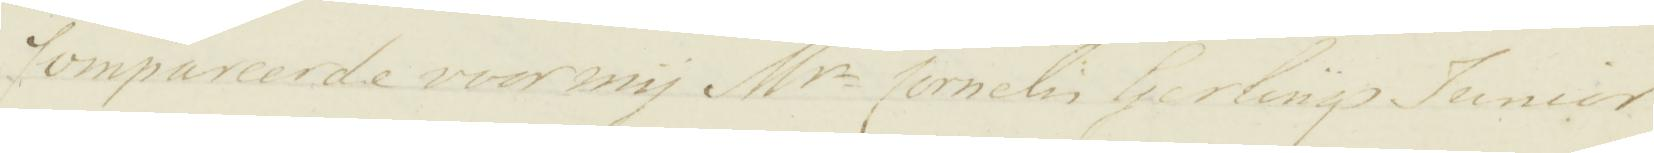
Compareerde voor mij Mr Cornelis Gerlings Junior
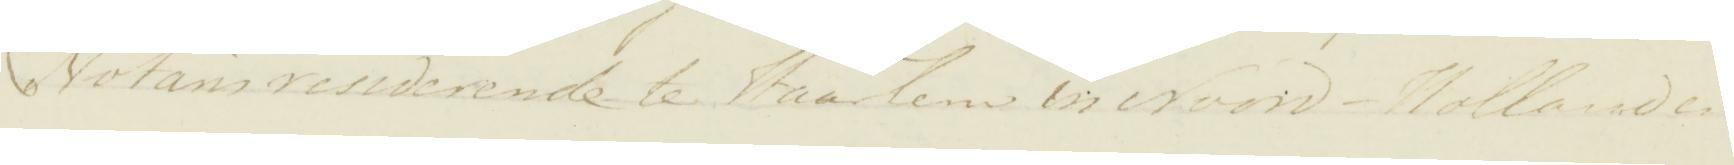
Notaris residerende te Haarlem in Noord-Holland en
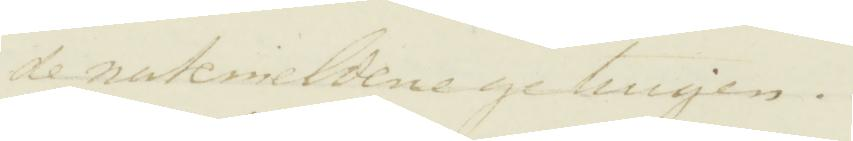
de natemeldene getuigen.
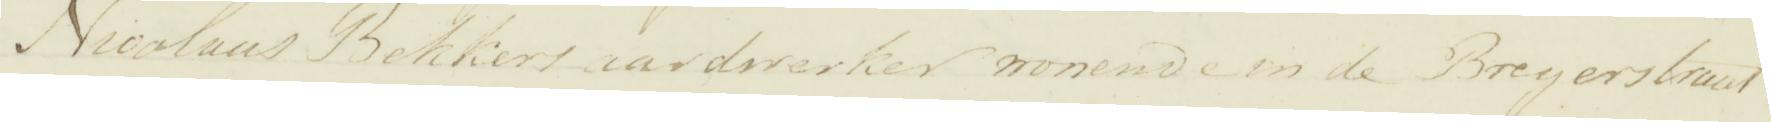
Nicolaas Bekkers aardwerker wonende in de Bregerstraat
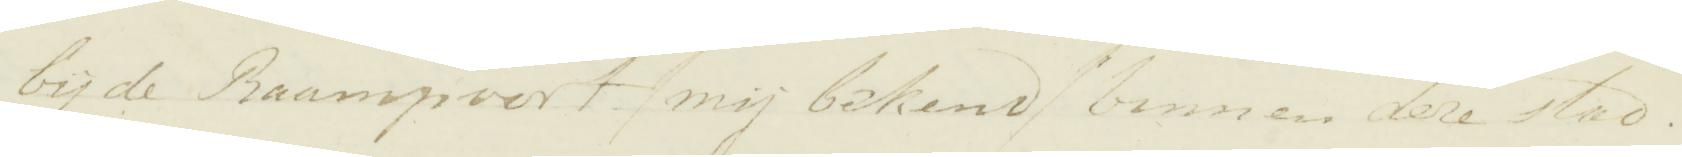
bij de Raampoort /mij bekend/ binnen deze stad.
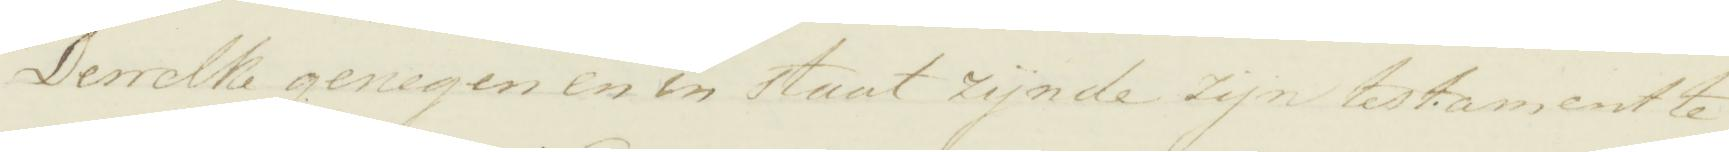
Dewelke genegen en in staat zijnde zijn testament te
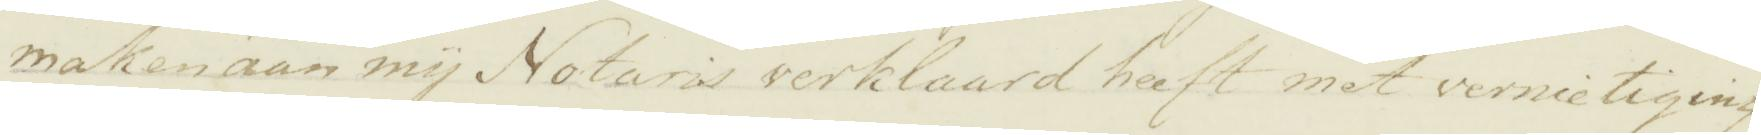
maken aan mij Notaris verklaard heeft met vernietiging
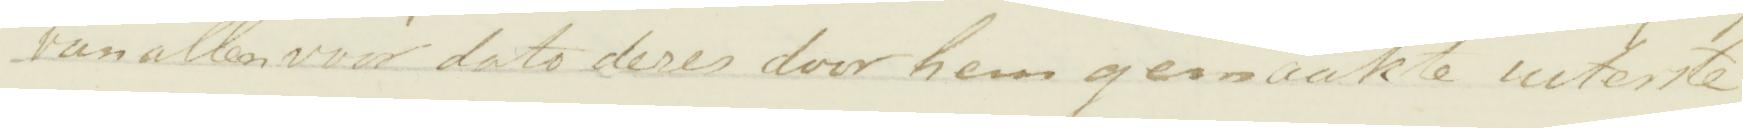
van allen voor dato dezes door hem gemaakte uiterste
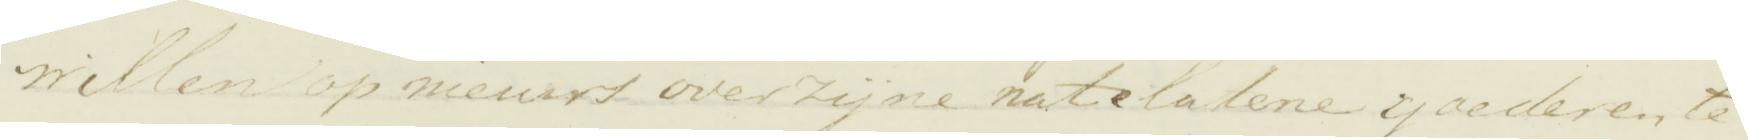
willen opnieuws over zijne natelatene goederen te
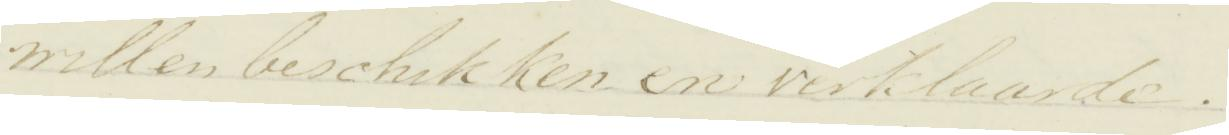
willen beschikken en verklaarde.
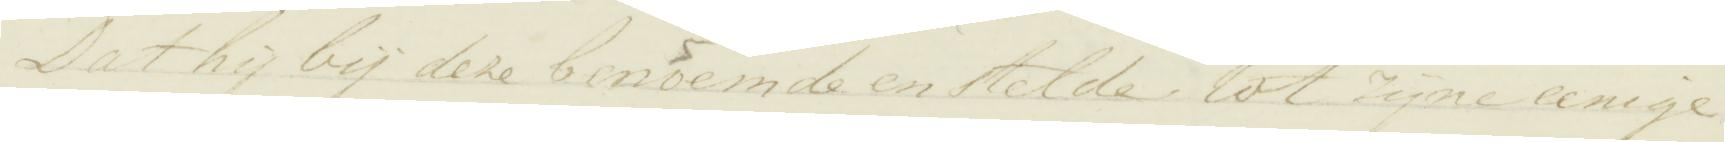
Dat hij bij deze benoemde en stelde tot zijne eenige
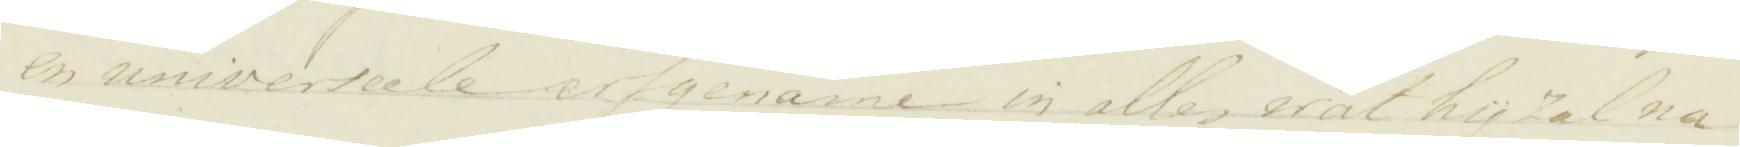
en universeele erfgename in alles wat hij zal na
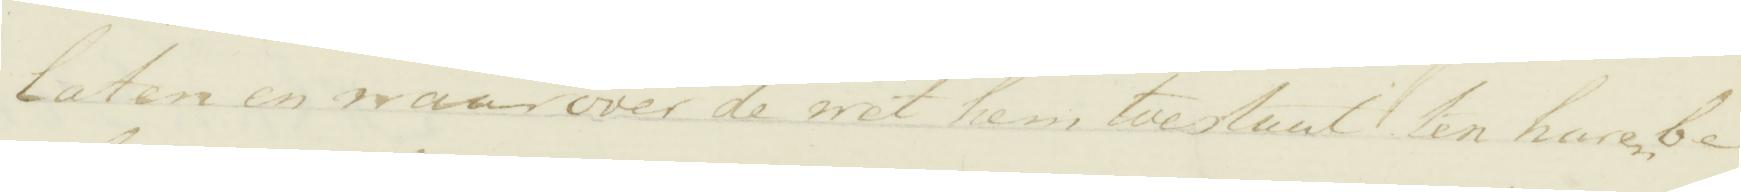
laten en waar over de wet hem toestaat ten haren be
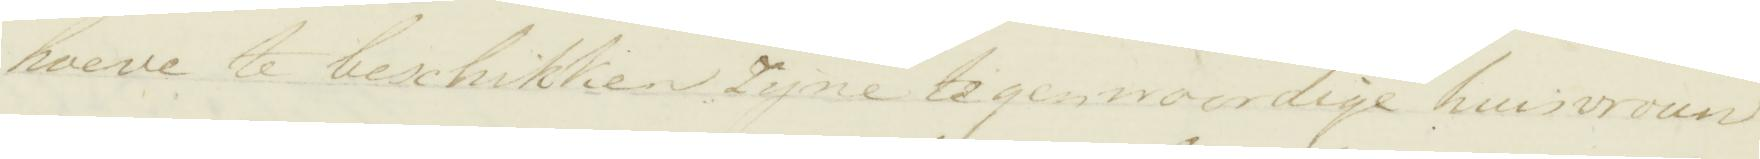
hoeve te beschikken zyne tegenwoordige huisvrouw
